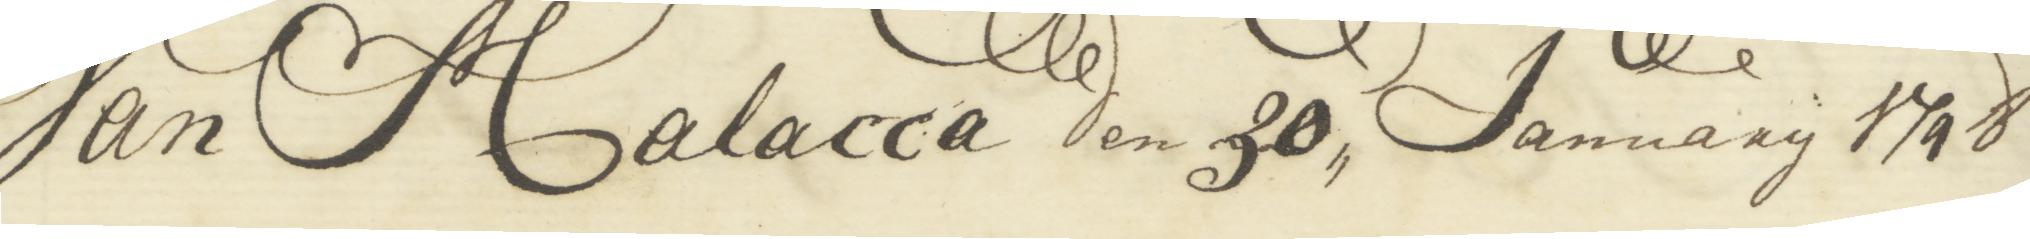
Van Malacca den 30„ Januarij 1748
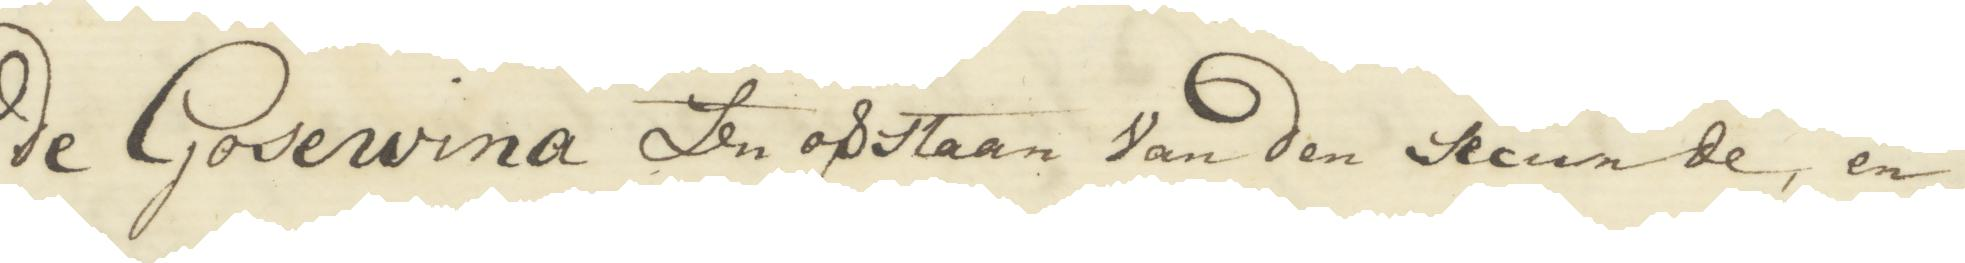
de Gosewina ten overstaan van den secunde, en
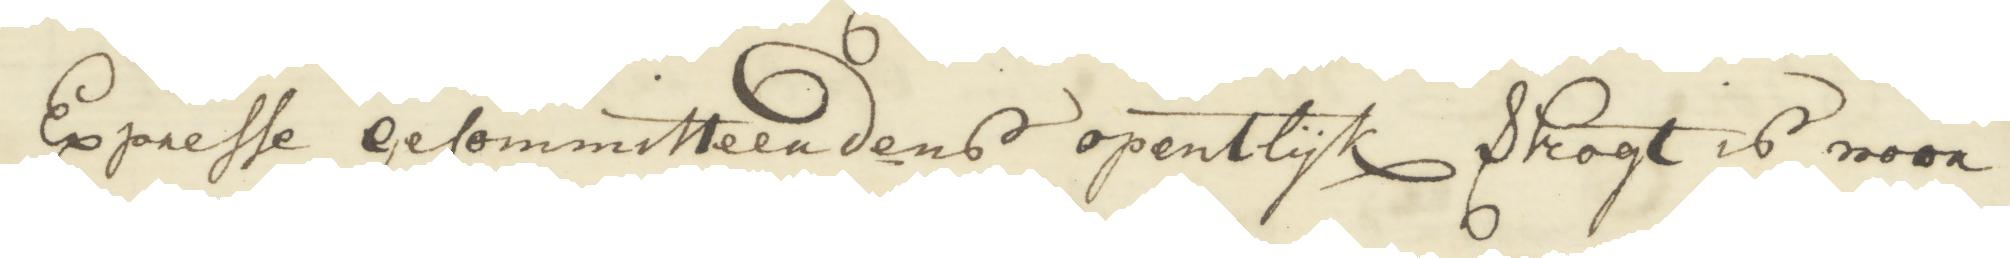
Expresse gecommitteerdens opentlijk verkogt is voor
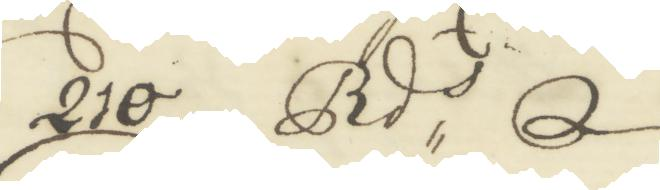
210. – Rd„s
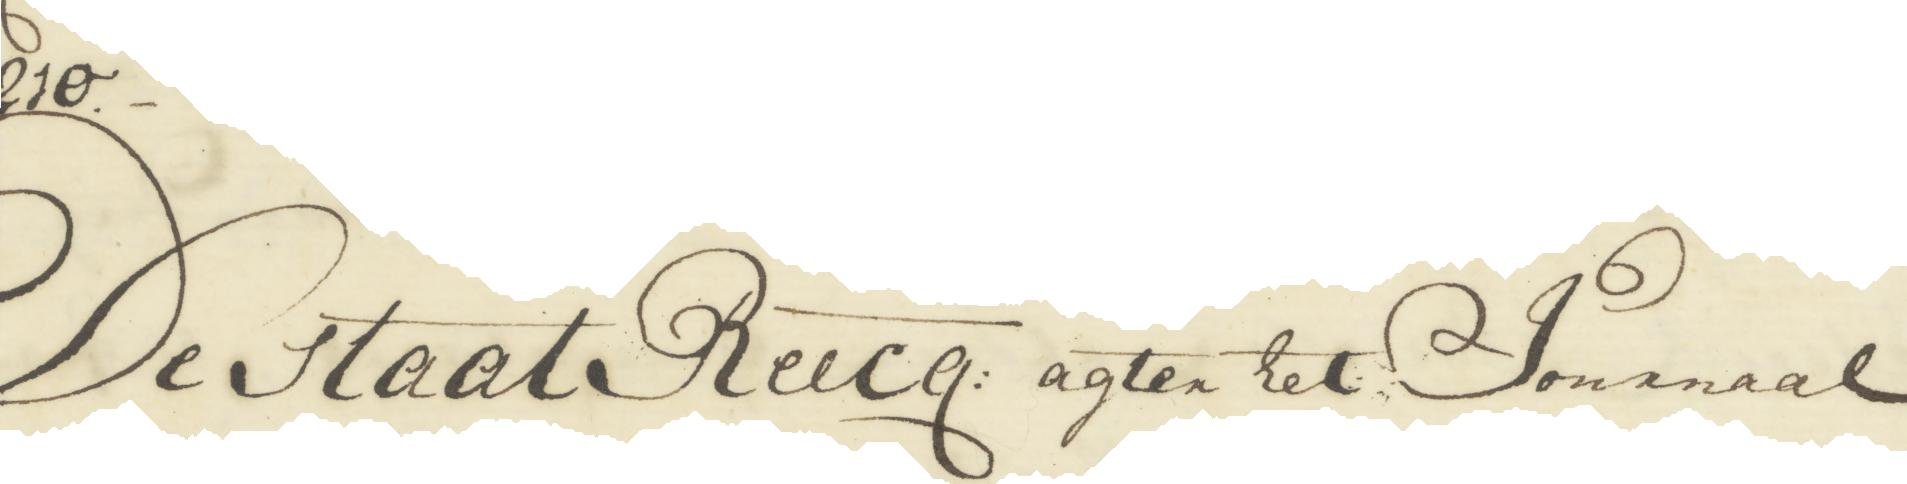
De staat Reecq: agter het Iournaal
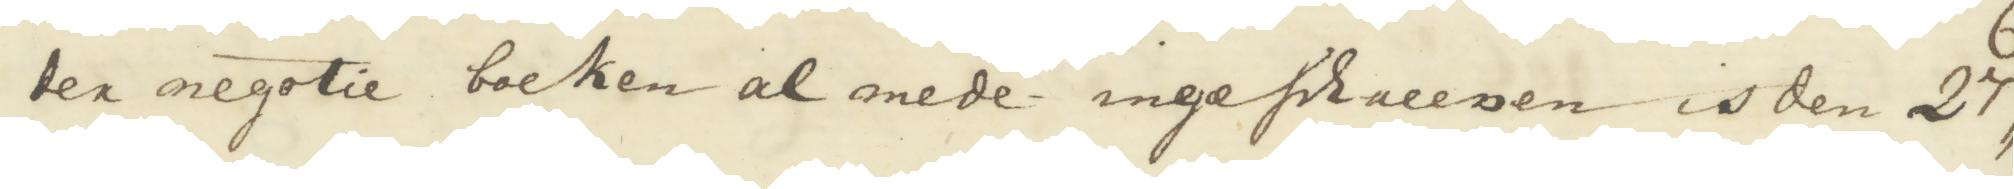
ter negotie boeken al mede ingeschreeven is den 27
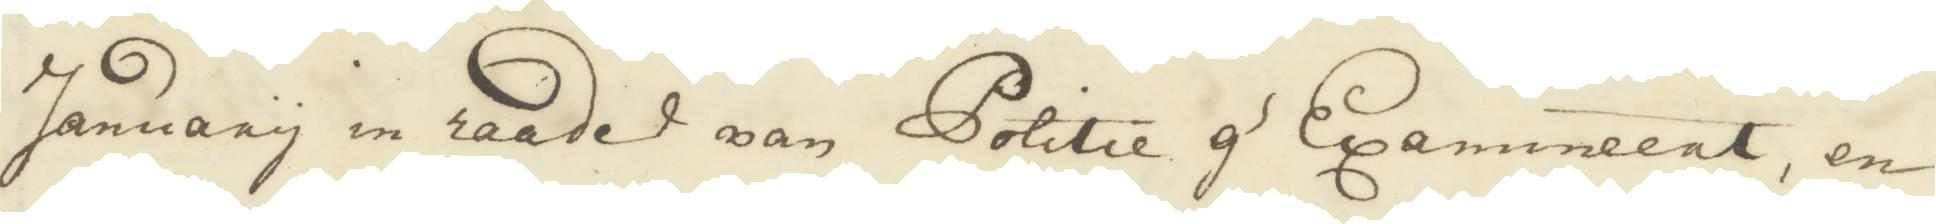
Januarij in raade van Politie g’Examineert, en
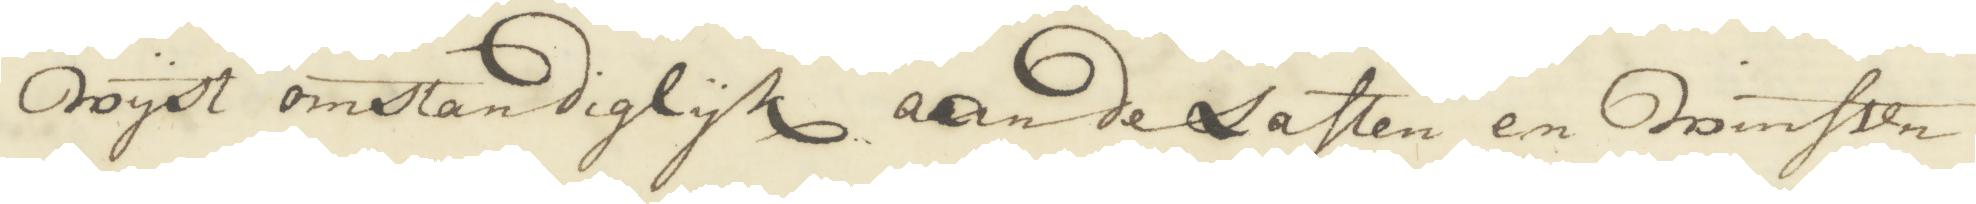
wijst omstandiglijk aan de Lasten en winsten
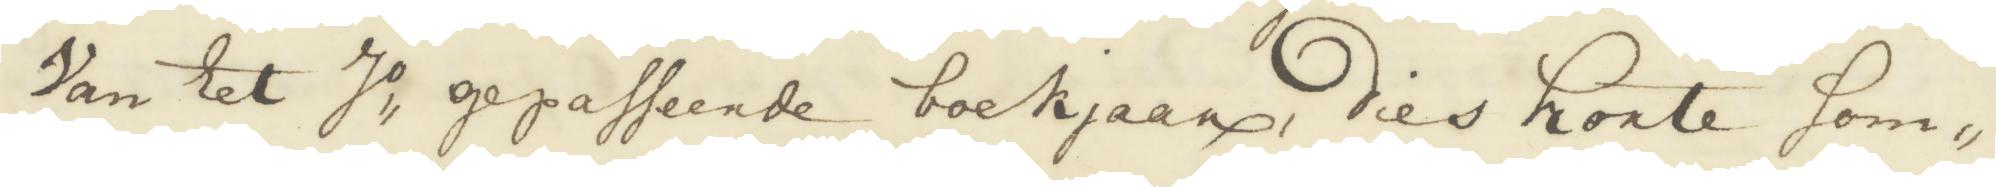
van het J„o gepasseerde boekjaar, dies korte som„
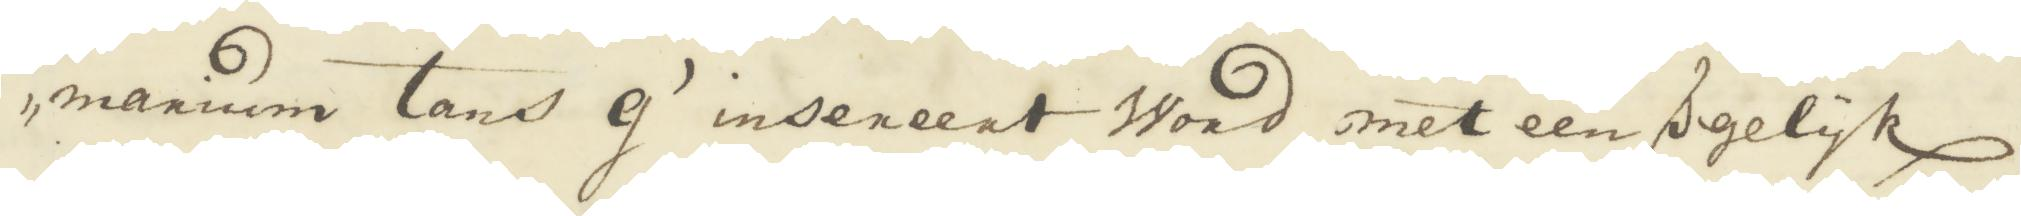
„marium tans g’insereert word met een vergelijk
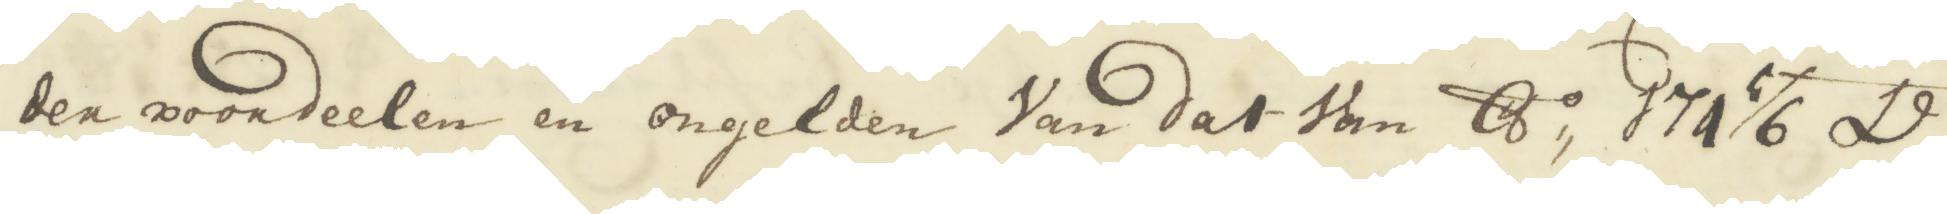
der voordeelen en ongelden van dat van A„o 174 5/6 te
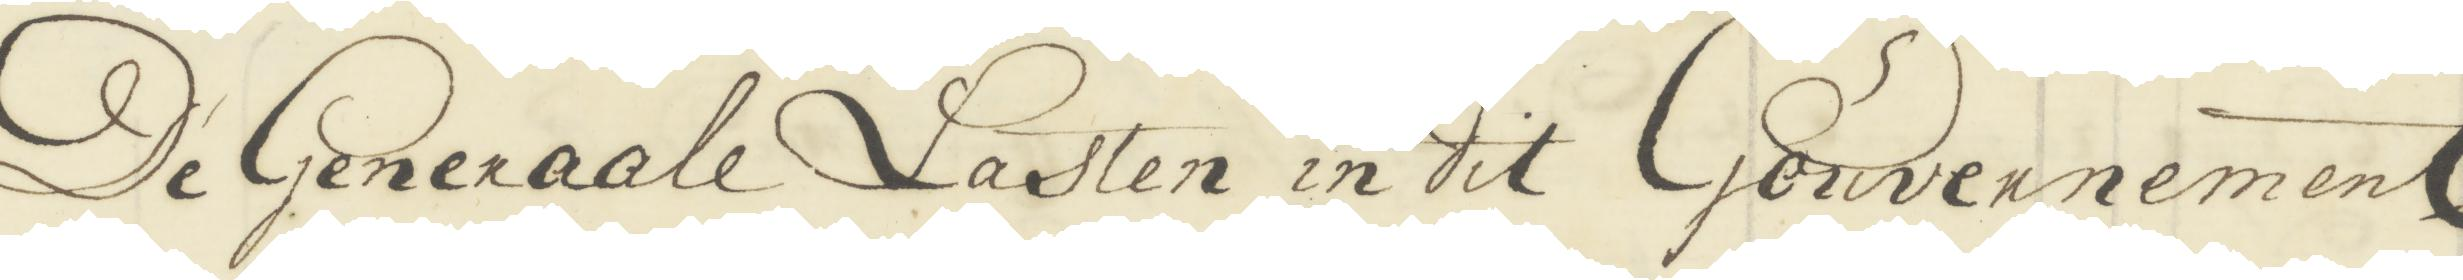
De Generaale Lasten in dit Gouvernement
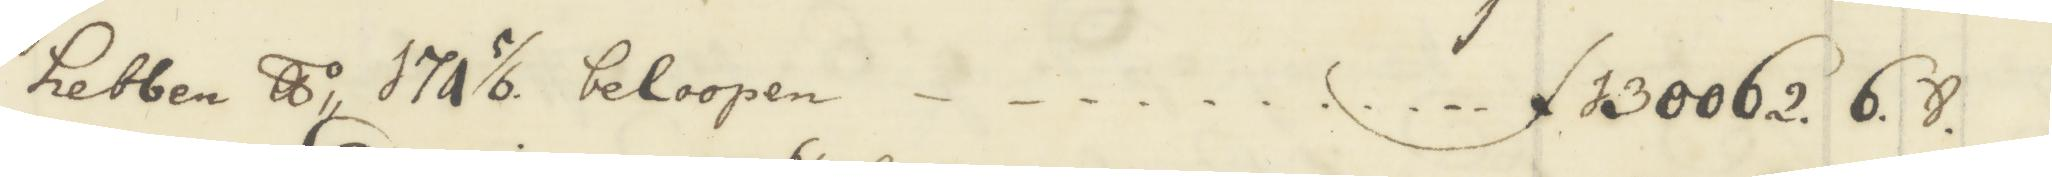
hebben A„o 174 5/6. beloopen - - - . . . . . . - - ƒ130062. 6. 8.
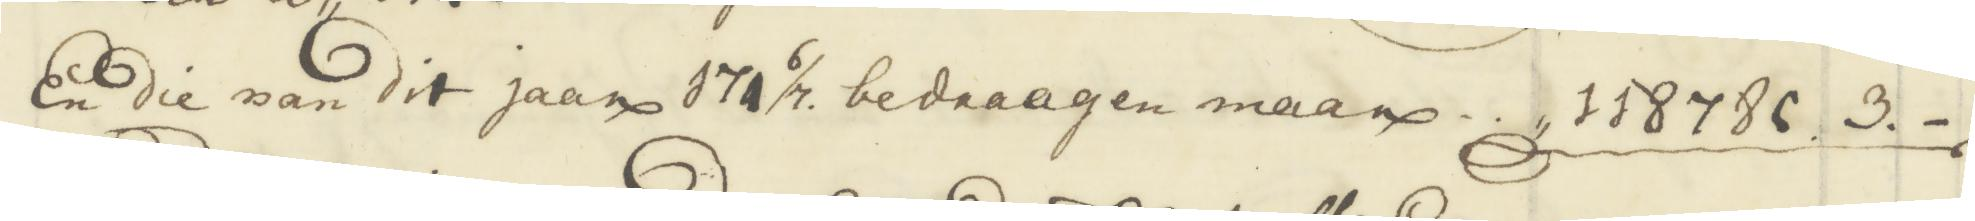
En die van dit jaar 174 6/7. bedraagen maar „118785. 3. –
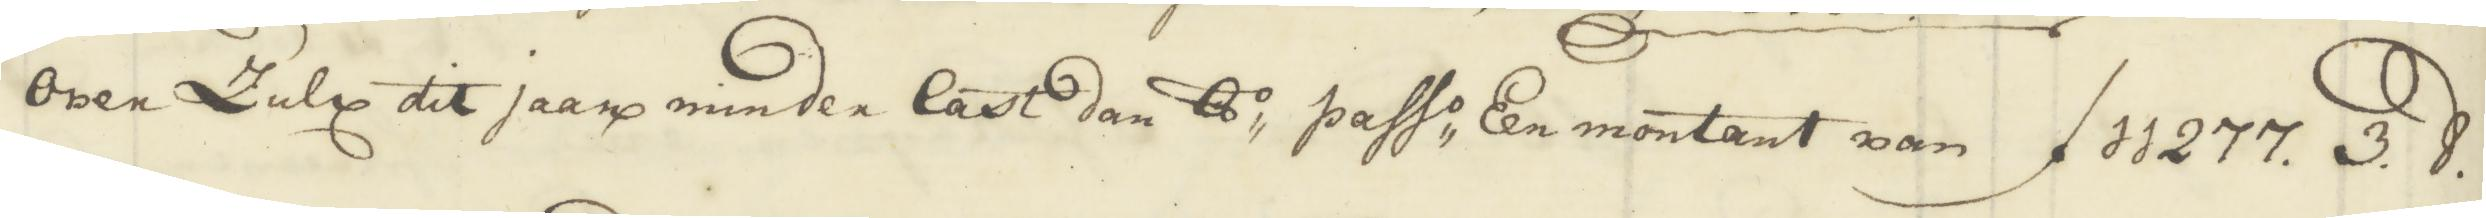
over zulx dit jaar minder last dan A„o pass„o Een montant van f11277.3.8.
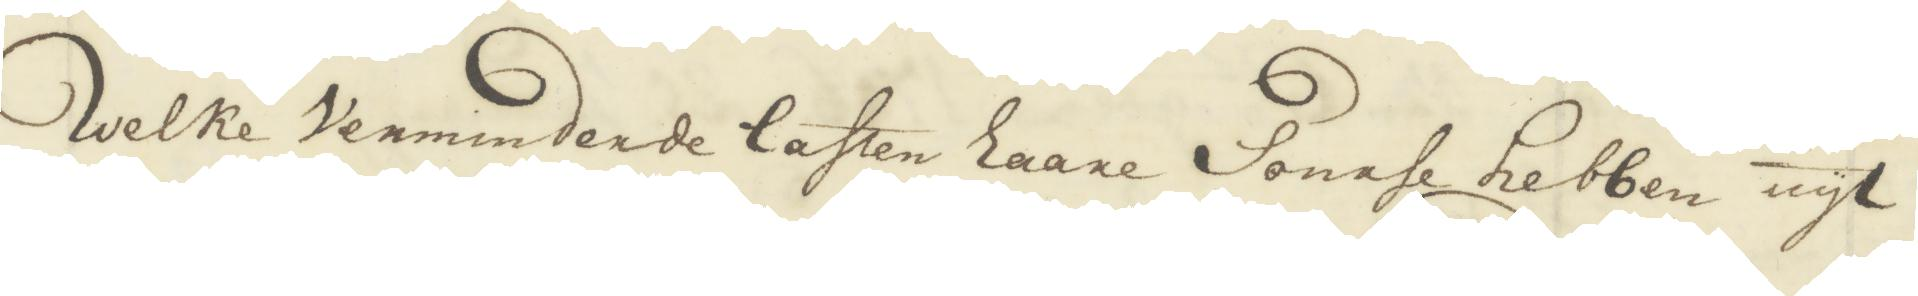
Welke verminderde lasten haare sourse hebben uijt
